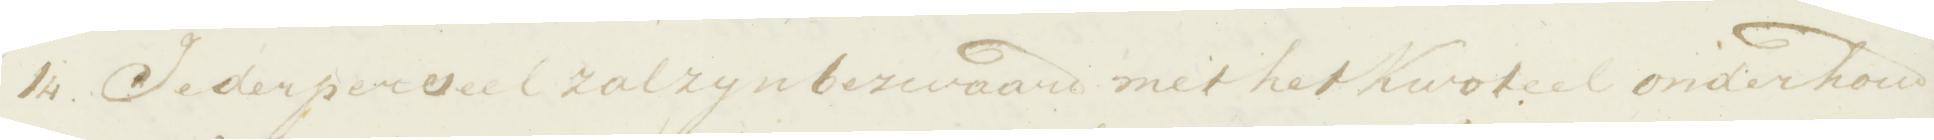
14. Ieder perseel zal zyn bezwaard met het kwoteel onderhoud
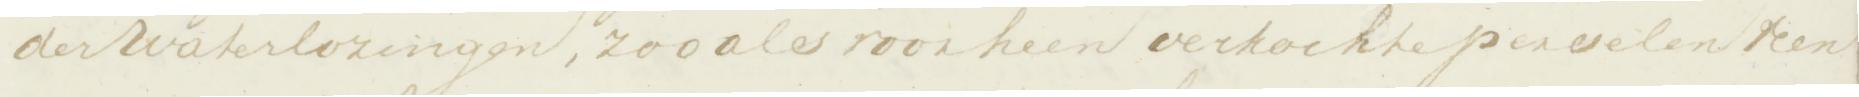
der waterlozingen, zoo als voorheen verkochte percelen tien
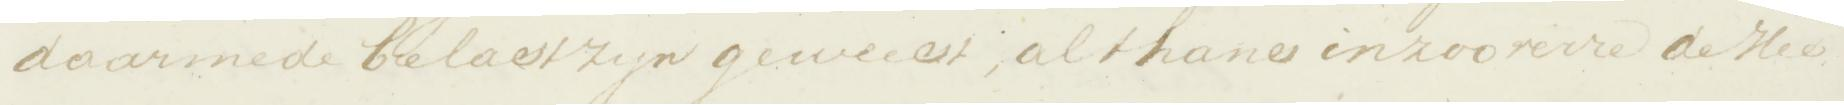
daarmede belast zyn geweest, althans inzooverre de Hee„
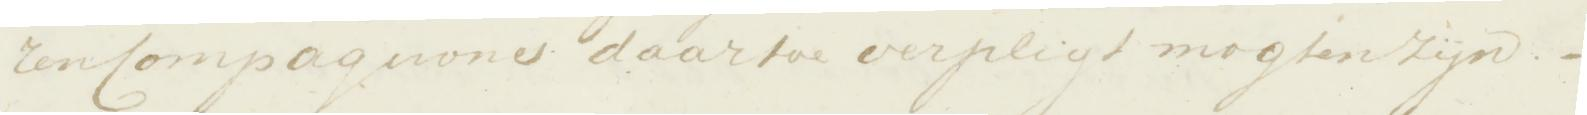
ren Compagnons daartoe verpligt mogten zijn.
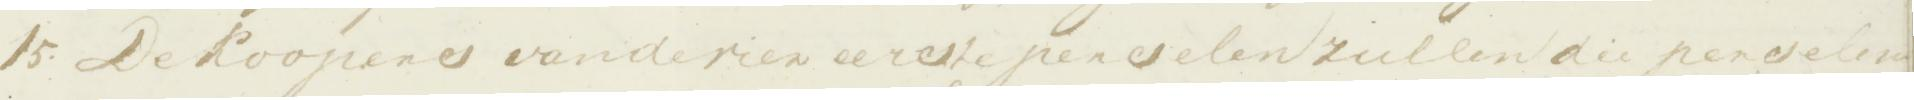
15. De Koopers van de vier eerste perselen zullen die perselen
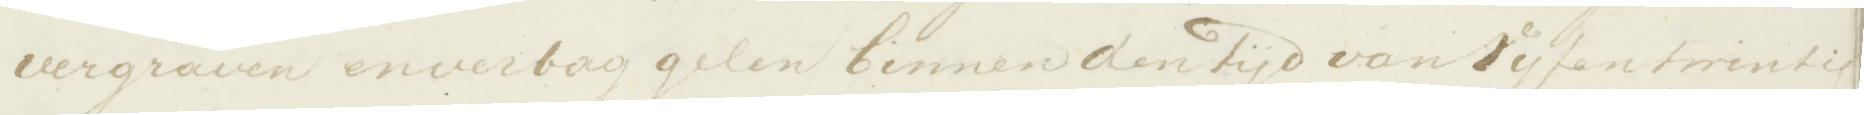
vergraven en verboggelen binnen den tijd van Vyfentwintig
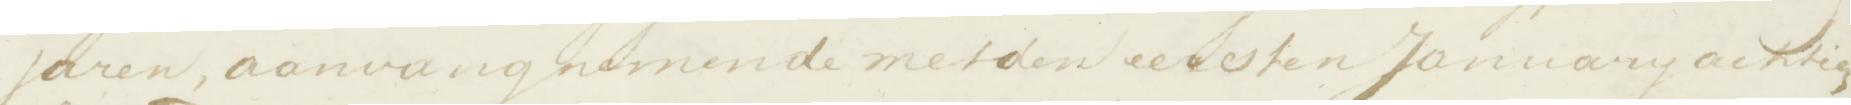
jaren, aanvang nemende met den eersten January achtien
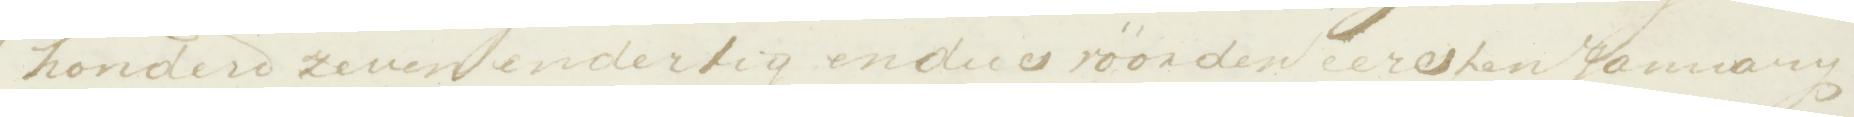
honderd zeven en dertig en dus vóór den eersten January
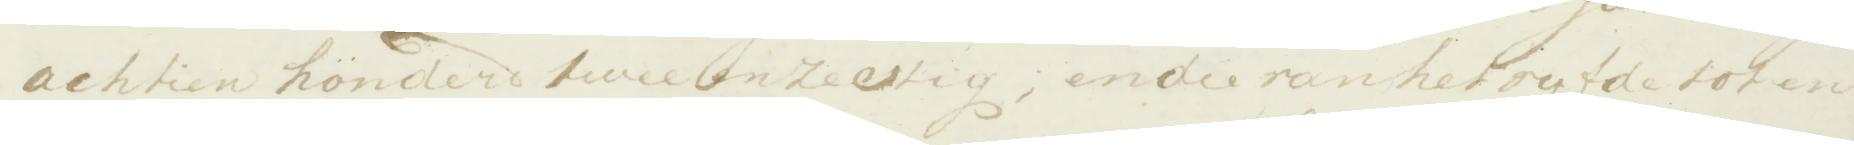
achtien hönderd twee en zestig; en die van het vyfde tot en
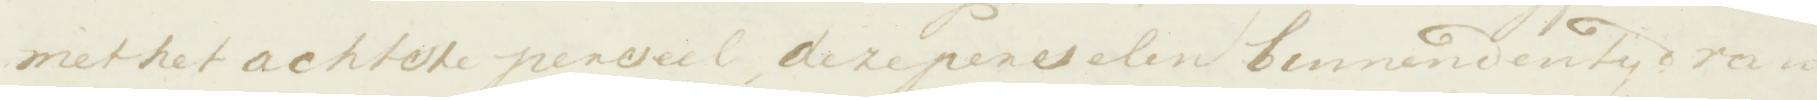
met het achtste perseel, deze perselen binnen den tyd van
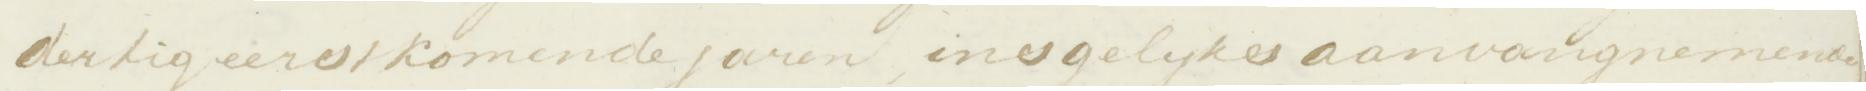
dertig eerstkomende jaren insgelyks aanvangnemende
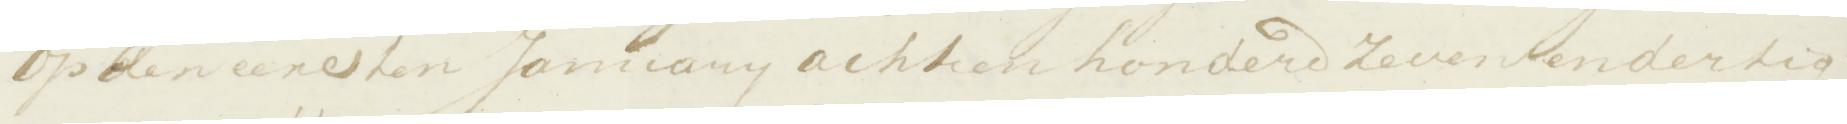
op den eersten January achtien honderd zeven endertig
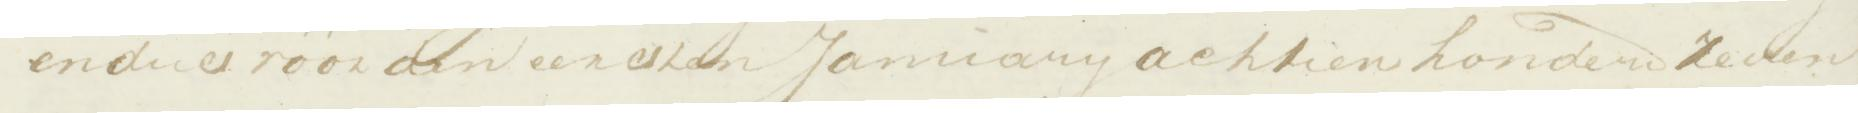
en dus vóór den eersten January achtien honderd zeven
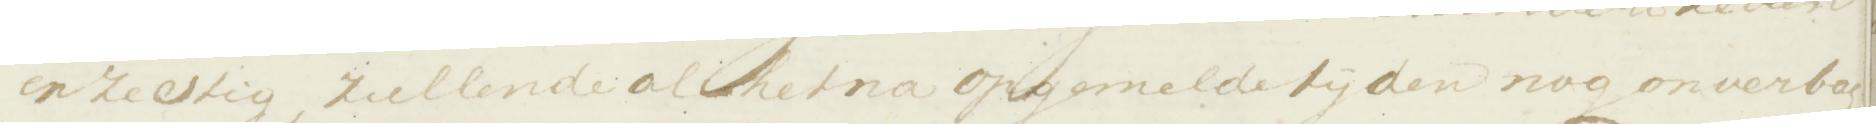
en zestig, zullende als het na opgemelde tijden nog onverbog
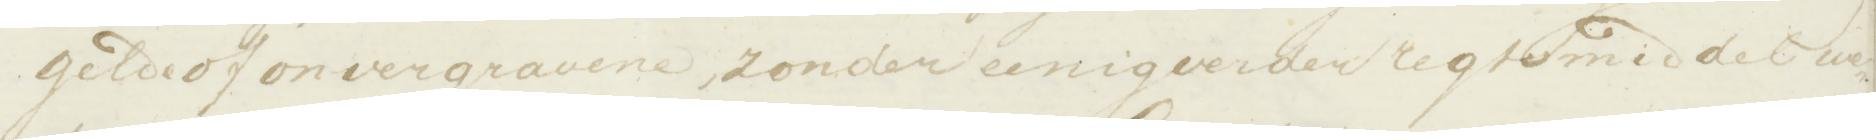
gelde of onvergravene, zonder eenig verder regtsmiddel we„
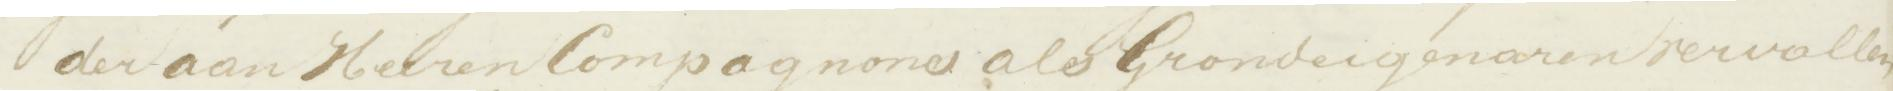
der aan Heeren Compagnons als Grondeigenaren vervallen
